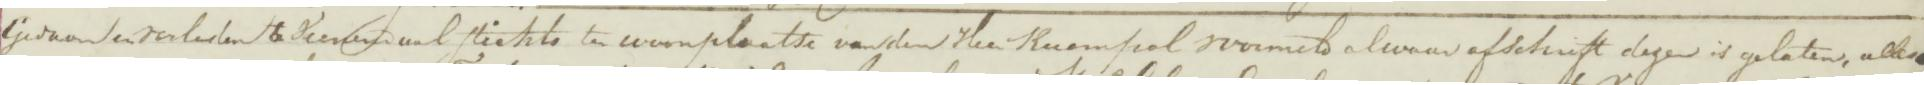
Gedaan an verleden te Veenendaal Stichts ten woonplaatse van den Heer Ruempol voormeld alwaar afschrift dezer is gelaten alles
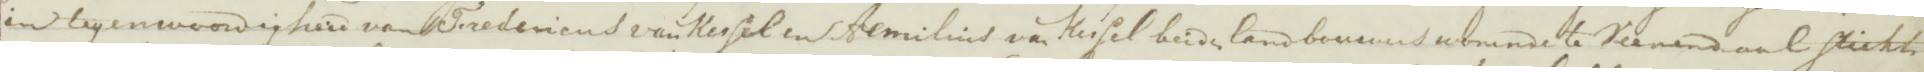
in tegenwoordigheid van Fredericus van Kessel en Aemilius van Kessel beide landbouwers wonende te Veenendaal Stichts
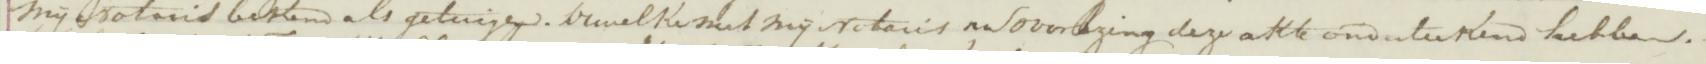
mij Notaris bekend als getuigen, Dewelke met mij Notaris na voorlezing deze akte onderteekend hebben.
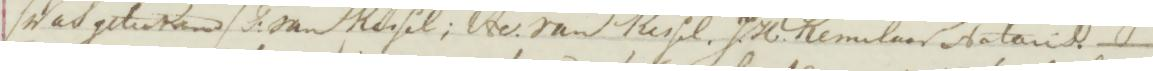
/was geteekend/ F: van Kessel; Ae. van Kessel, J: H. Kemelaar Notaris
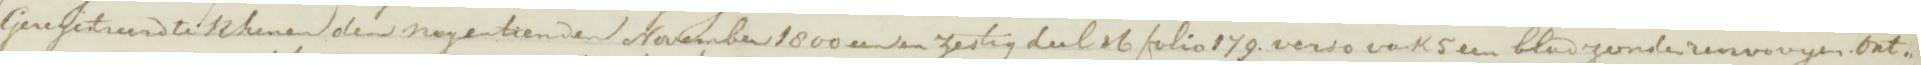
Geregistreerd te Rhenen den negentienden November 1800 een en zestig deel 16 folio 179. verso vak 5 een blad zonder renvooyen ont„
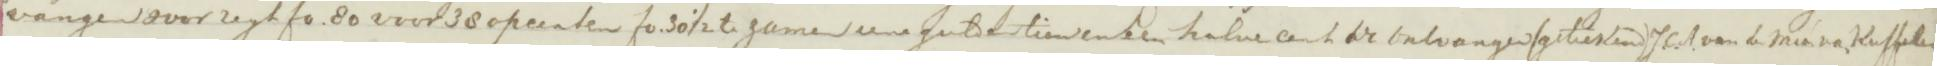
vangen voor regt ƒ 0. 80 voor 38 opcenten ƒ0.30½ te zamen een gulden tien en een halve cent de ontvanger geteekend J.C.A. van de Meer van Kuffelaar
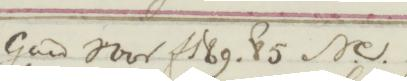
Goed voor ƒ189.85 NC
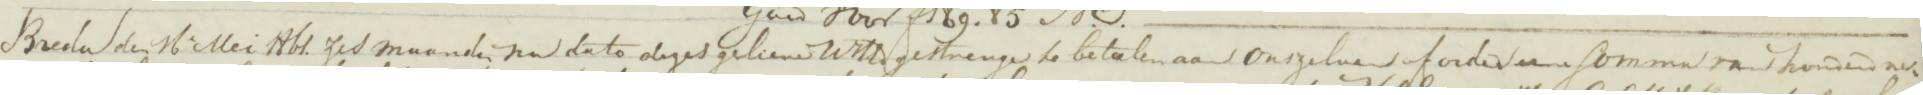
Breda den 16 Mei 1861 zes maanden na dato dezes gelieve UHE gestrenge te betalen aan onszelven af order eene somma van 1 honderd ne
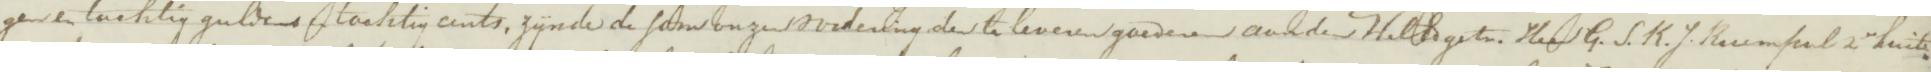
gen en tachtig guldens en tachtig cents, zijnde de som onzer vordering der te leveren goederen aan den HE Ed getr. Heer G. S. K. J. Ruempol 2 luite„
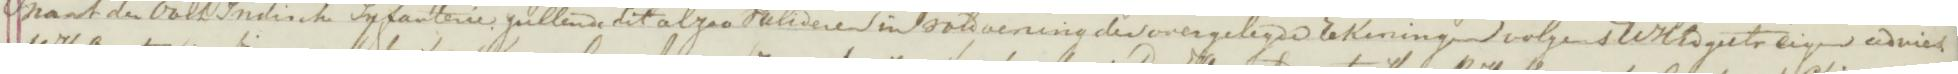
nant derOost Indische Infanterie zullende dit alzoo Valideren in voldoening des overgelegde rekeningen volgens UH Ed gestr eigen advies
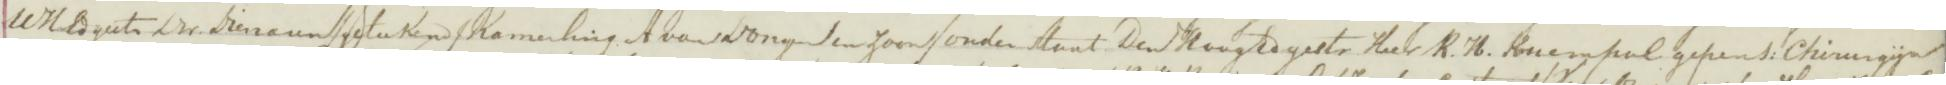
UH Ed gestr Dw. Dienaren /geteekend / Kamerling A van Dongen en zoon /onderstaat Den Hoog Ed. gestr Heer R. H. Ruempol gepens: Chirurgijn
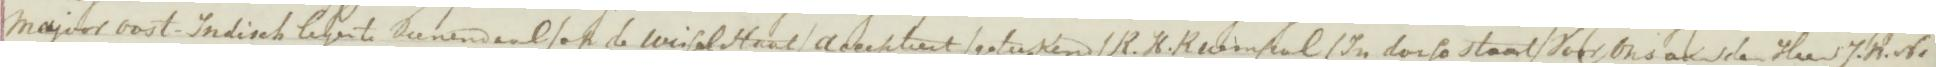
Majoor Oost-Indisch leger te Veenendaal/ op de Wissel staat / accepteert /geteekend / R. H. Ruempol (In dorso staat Voor ons aan de Heer J.N N. W. N
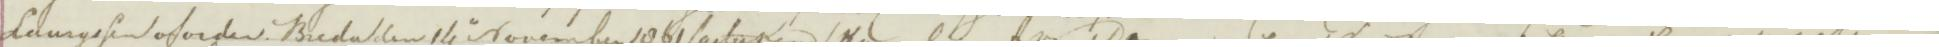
Lauryssen of order. Breda den 14' November 1861 / geteekend/ Kamerling A van Dongen en zoon. Voor mij aan de Heeren Vlaer en Koll of orders
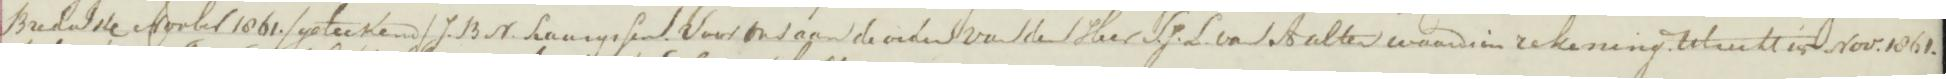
Breda december 1861. /geteekend/ J. B N. Laarijssen Voor ons aan de order van den Heer S. J: L en Aaltnr waarin rekeningUtrecht in Nov: 1861„
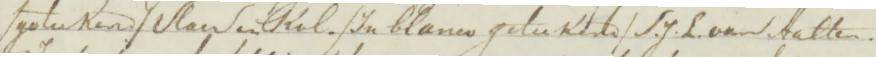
/geteekend:/ Vlaer en Kol. / In blanco geteekend/ S: J: L van Aalten.
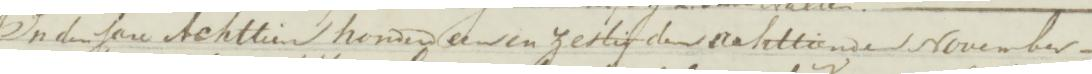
In den Jan Achttien honderd een en zestig den achttiende November
